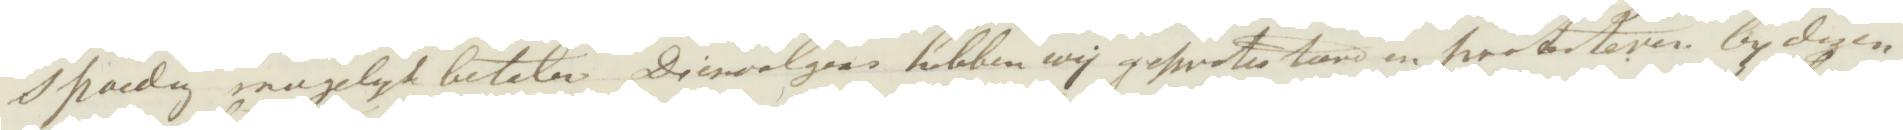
spoedig mogelyk betalen Dienvolgens hebben wij geprotesteerd en protesteren by dezen
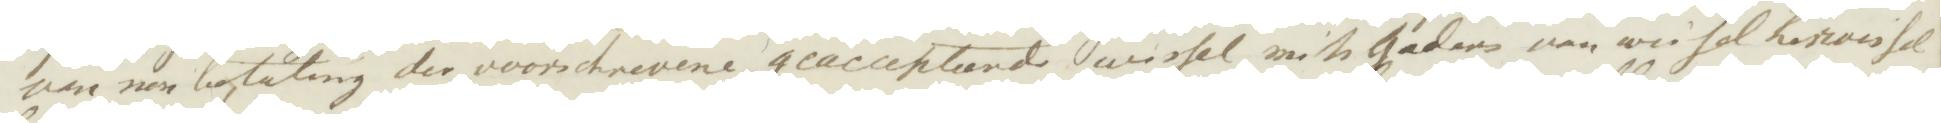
van non betaling der voorschrevene geaccepteerde wissel mitsgaders van wissel herwissel
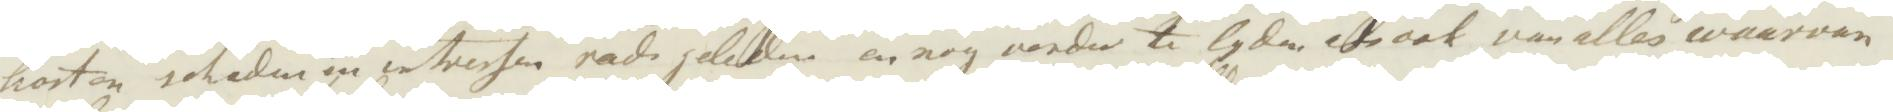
kosten schaden en intressen reeds geleden en nog verder te lyden als ook van alles waarvan
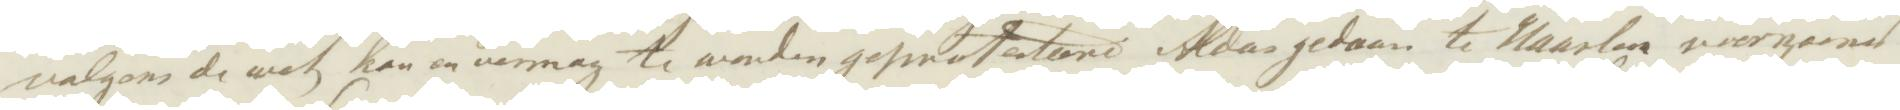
volgens de wet kan en vermag te worden geprotesteerd Aldus gedaan te Haarlem voornoemd
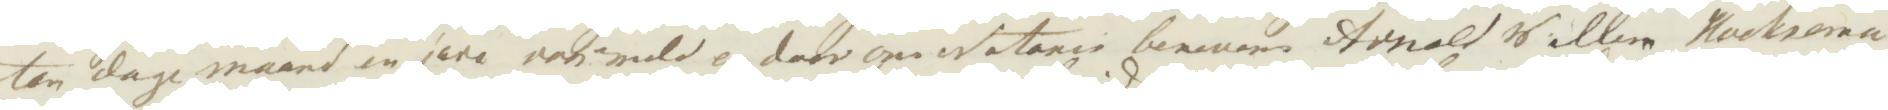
ten dage maand en jare voormeld en door ons Notaris benevens Arnold Willem Haeksema
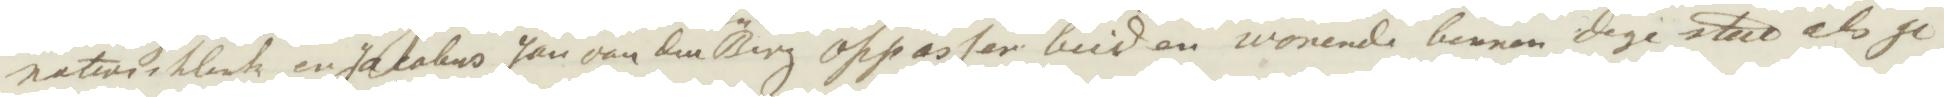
notaris klerk en Jacobus Jan van den Berg oppasser beiden wonende binnen deze stad als ge
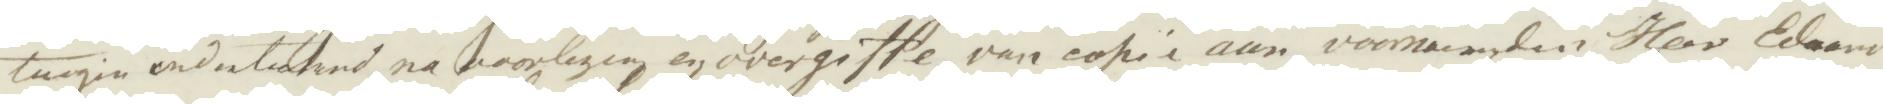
tuigen onderteekend na voorlezing en overgifte van copie aan voornoemden Heer Eduard
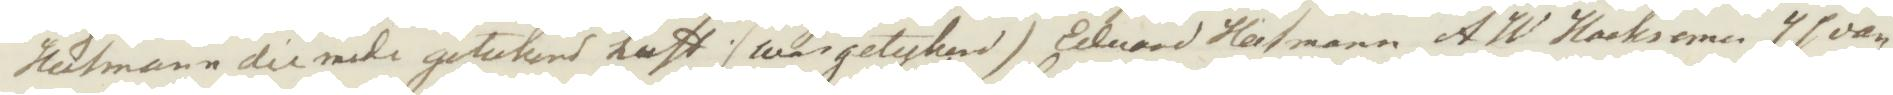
Heitmann die mede geteekend heeft (was geteekend) Eduard Heitmann A W Haeksema J J van
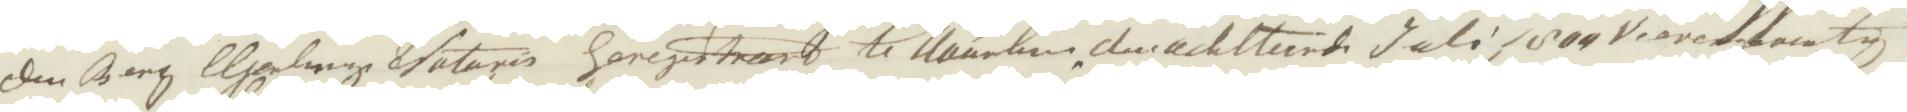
den Berg C Gerlings Notaris Geregistreerd te Haarlem, den achttiende Iuli 1800 Vierenzeventig
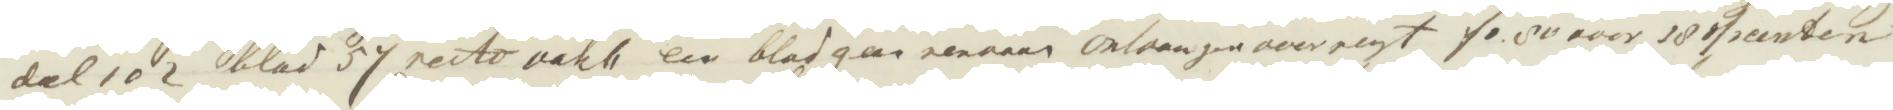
deel 102 blad 57 recto vak 6 een blad geen renvooi Ontvangen voor regt ƒ0. 80 voor 38 opcenten
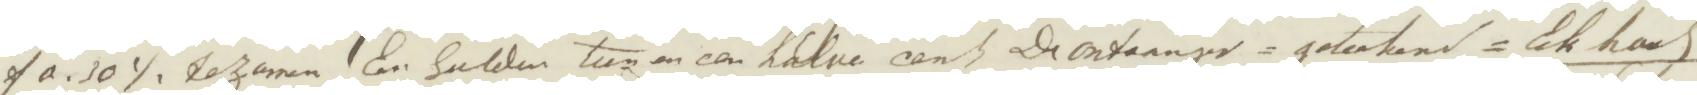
ƒ 0. 30½ tezamen Een Gulden tien en een halve cent De ontvanger = geteekent = Eekhout
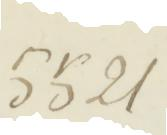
5521
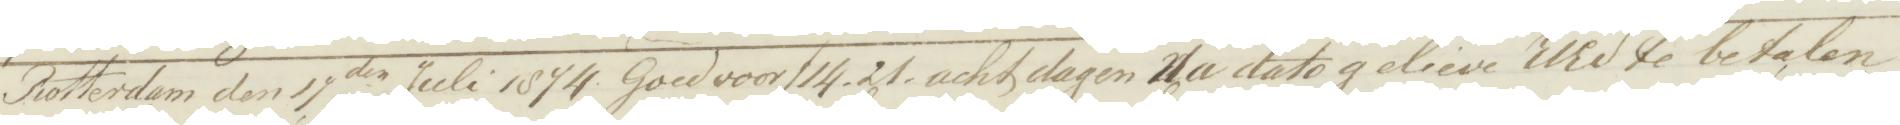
Rotterdam den 17 den Juli 1874 goed voor ƒ 14. 21. acht dagen Na dato gelieve UEd te betalen
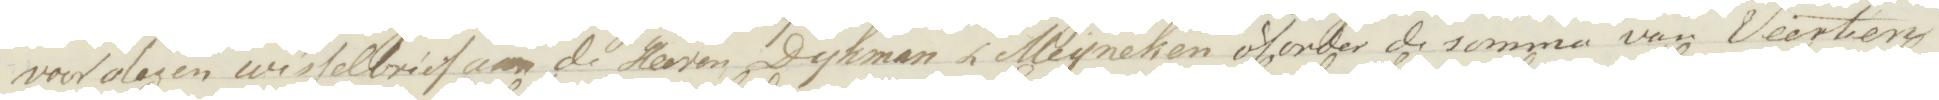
voor dezen wisselbrief aan de Heeren Dykman & Meijneken of order de somma van Veertien
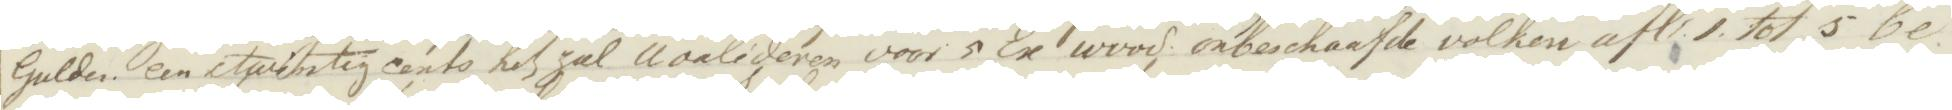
Gulden een entwintig cents het zal Uoalideren voor 5 Ex woord onbeschaafde volken afb. 1. tot 5 be„
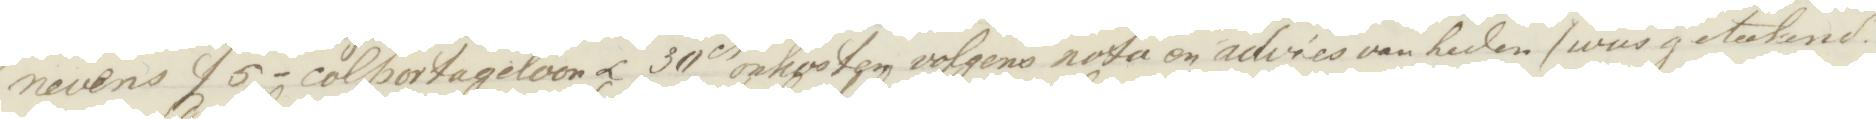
nevens ƒ 5 — colportageloon & 30 ct onkosten volgens nota en advies van heden (was geteekend.)
